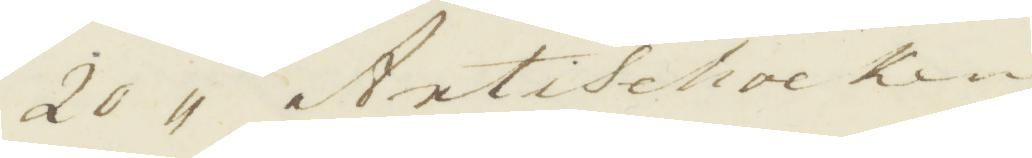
20 „ Artischocken
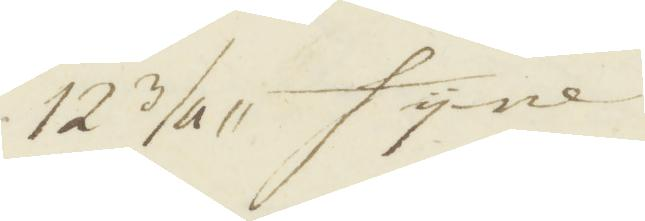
12¾„ fijne
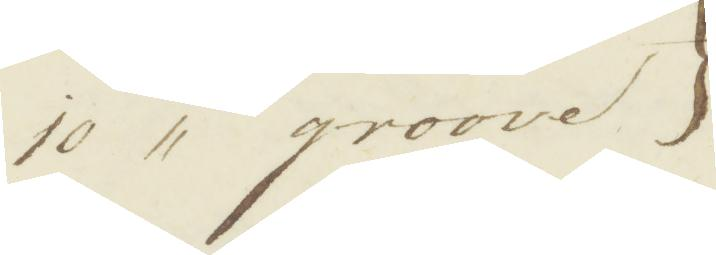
10 „ groove
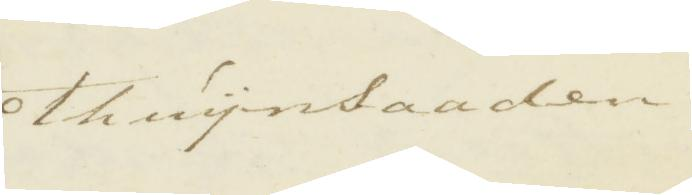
thuijnsaaden
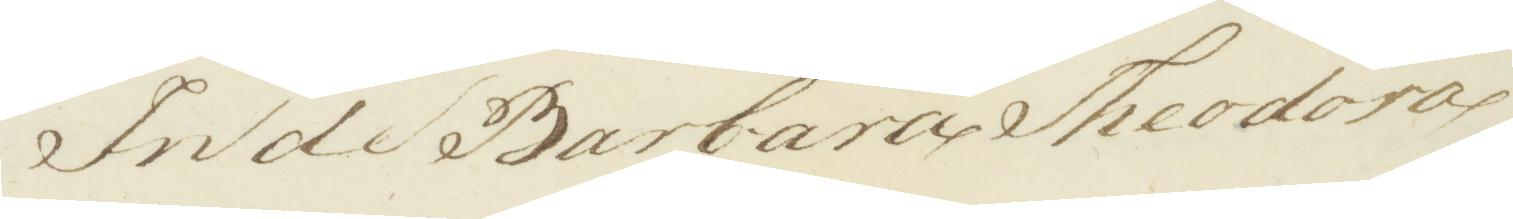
In de Barbara Theodora
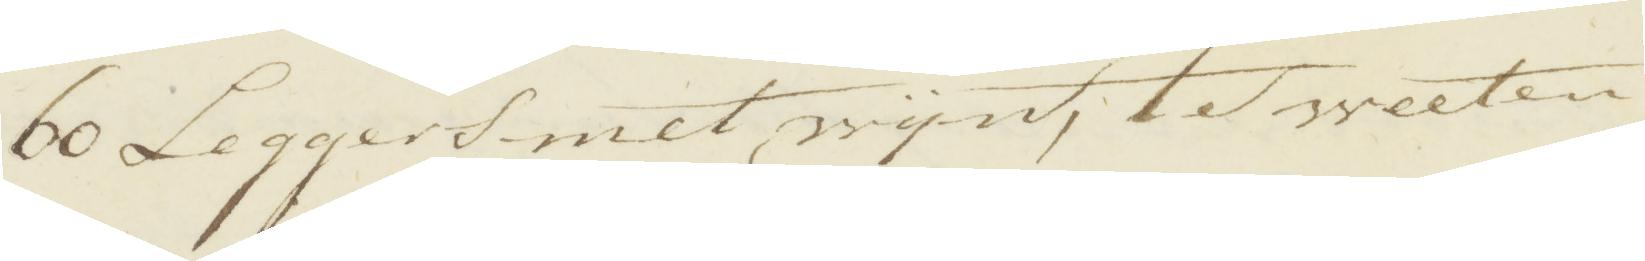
60 Leggers met wijn, te weeten
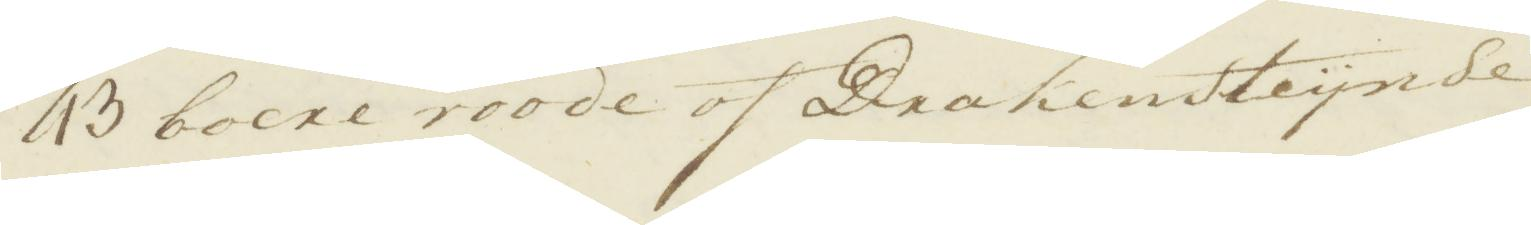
43 boere roode of Drakensteijnse
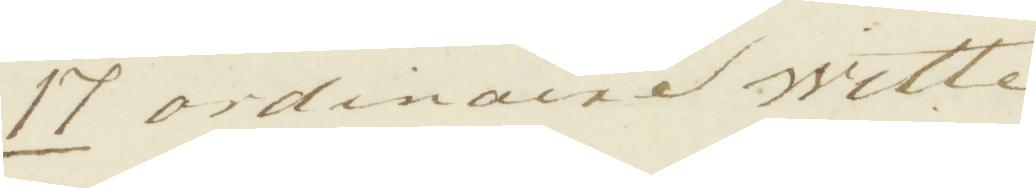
17 ordinaire witte
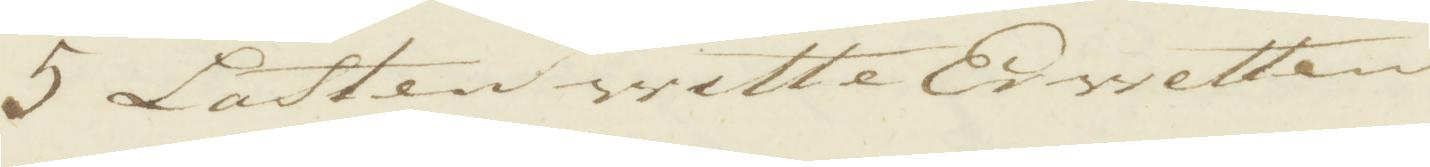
5 Lasten witte Erwetten
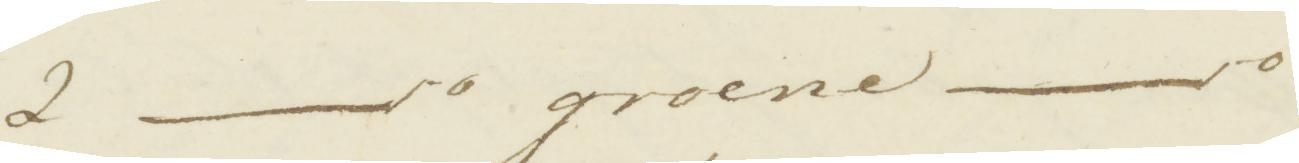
2 _o groene _o
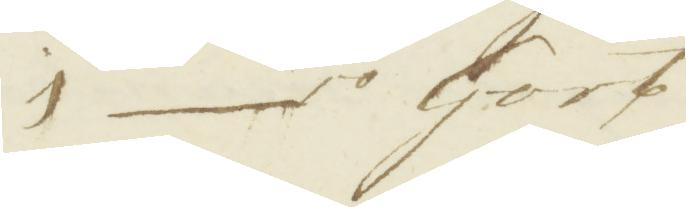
1 _o Gort
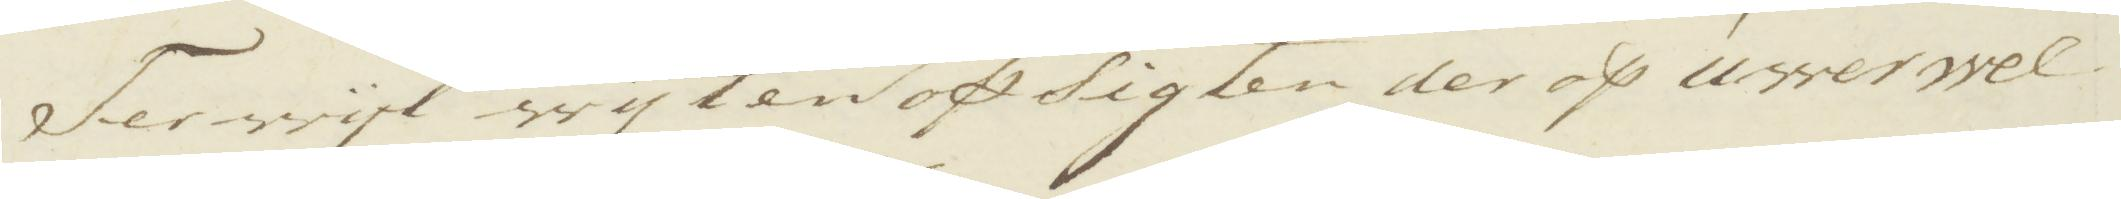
Terwijl wij ten opsigten der op uwer wel-
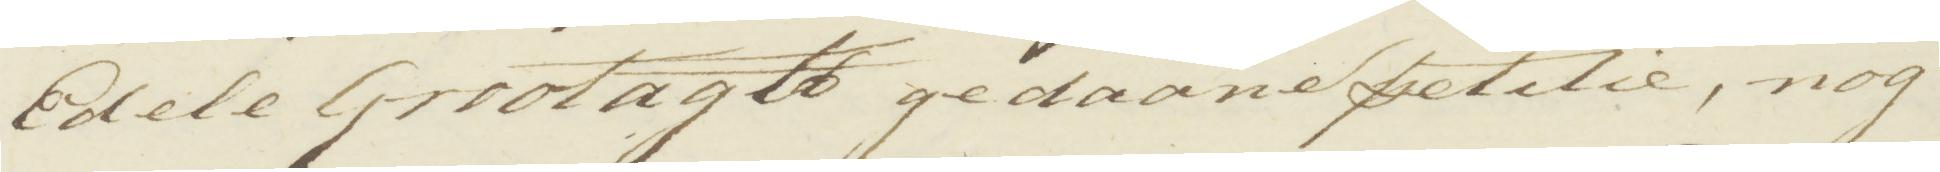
Edele Grootagtb gedaane petitie, nog
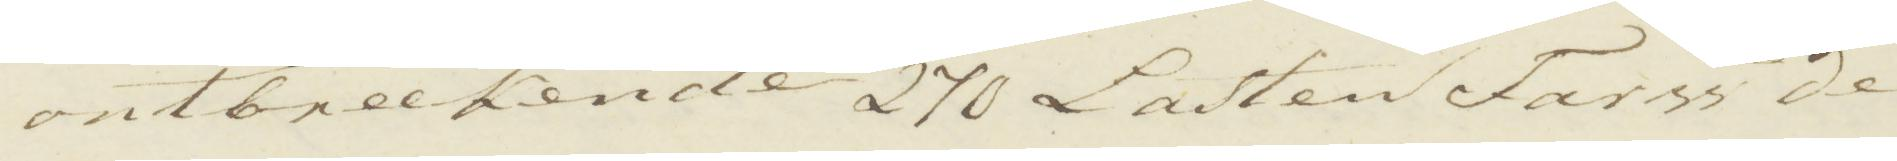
ontbreekende 270 Lasten Tarw de
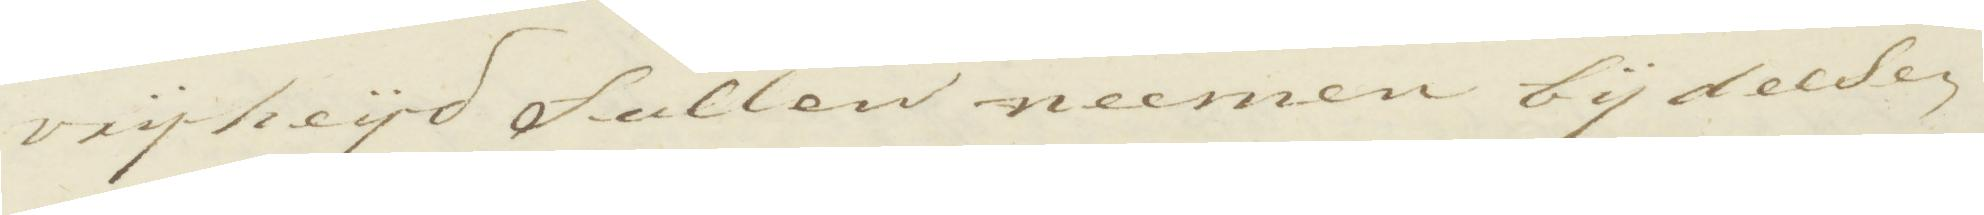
vrijheijd sullen neemen bij deesen
